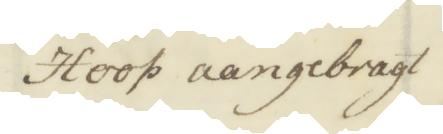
Hoop aangebragt
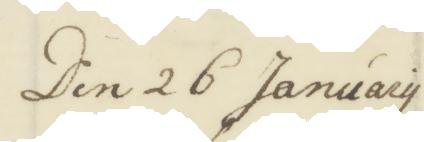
Den 26 Januarij
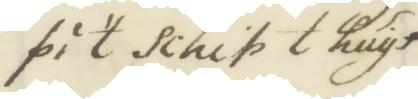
p,r ’t schip t huijs
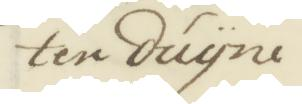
ter duijne
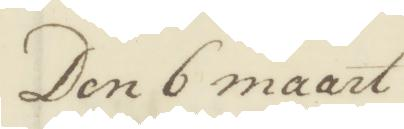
Den 6 maart
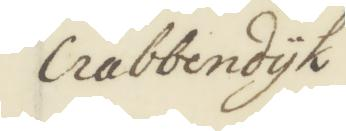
Crabbendijk
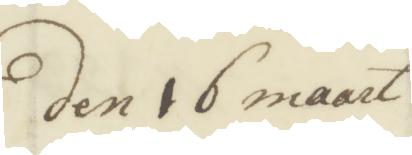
den 16 maart
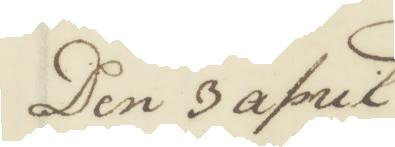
Den 3 april
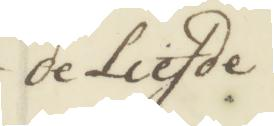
de Liefde
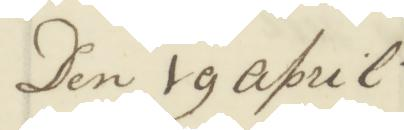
Den 19 april
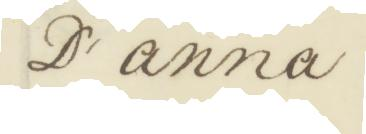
D' anna
